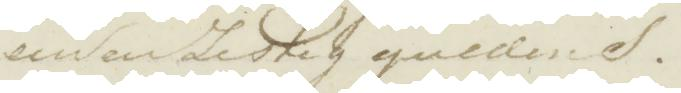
een en zestig guldens.
